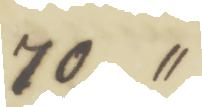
70 „
